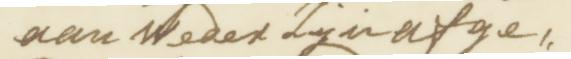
aan weder zijn afge„
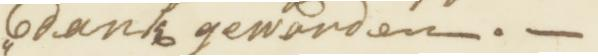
„dank geworden. —
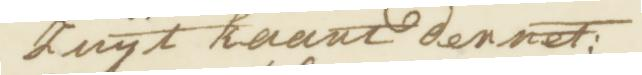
zuijt kaart der net:
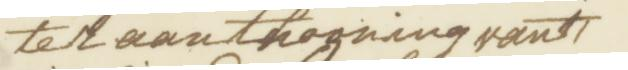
ter aanthooning vant'
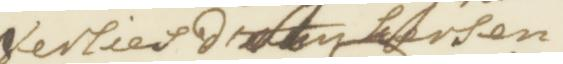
verlies d'aankers en
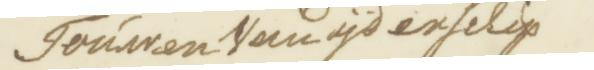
Touwen van ijder schip
